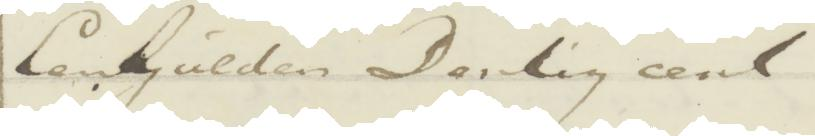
EenGulden Dertig cent
